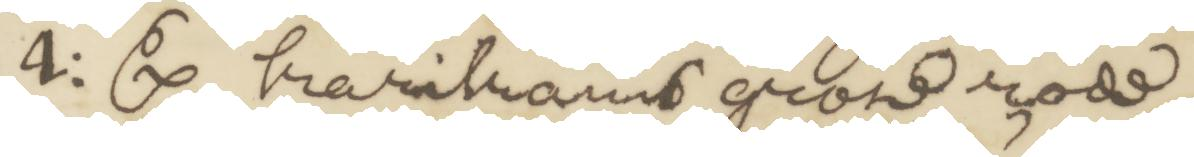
4: Ex„ karikams grote rode
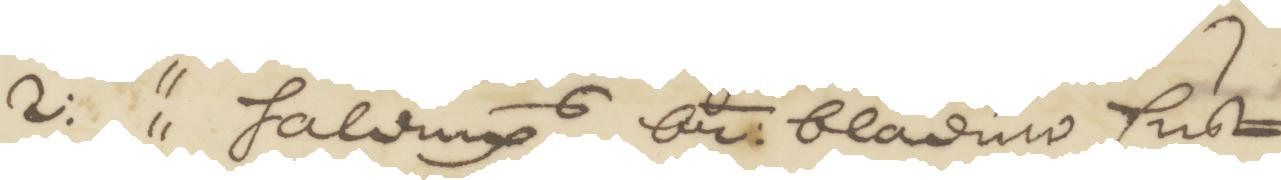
2: „ salemp„s br: blaeuw Cust
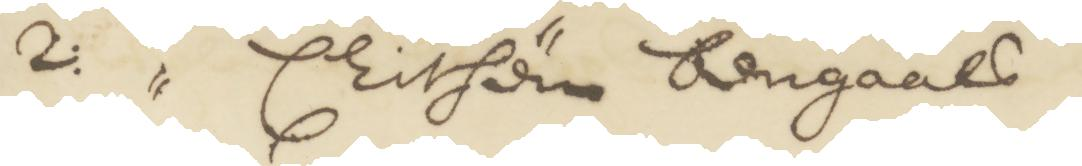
2: „ Chitsen bengaals
